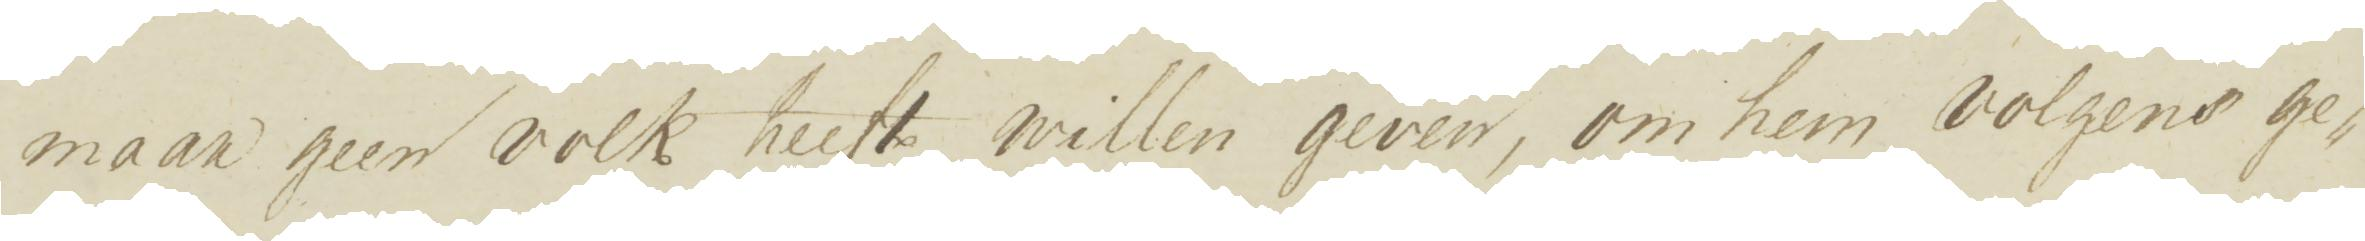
maar geen volk heeft willen geven, om hem volgens ge„
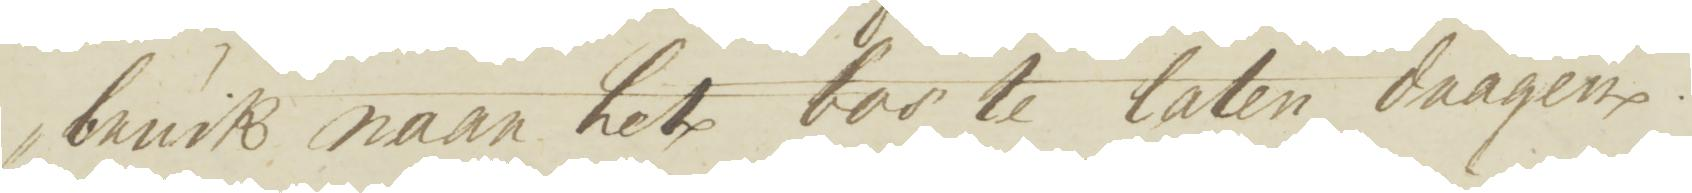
„bruik naar het bos te laten dragen.
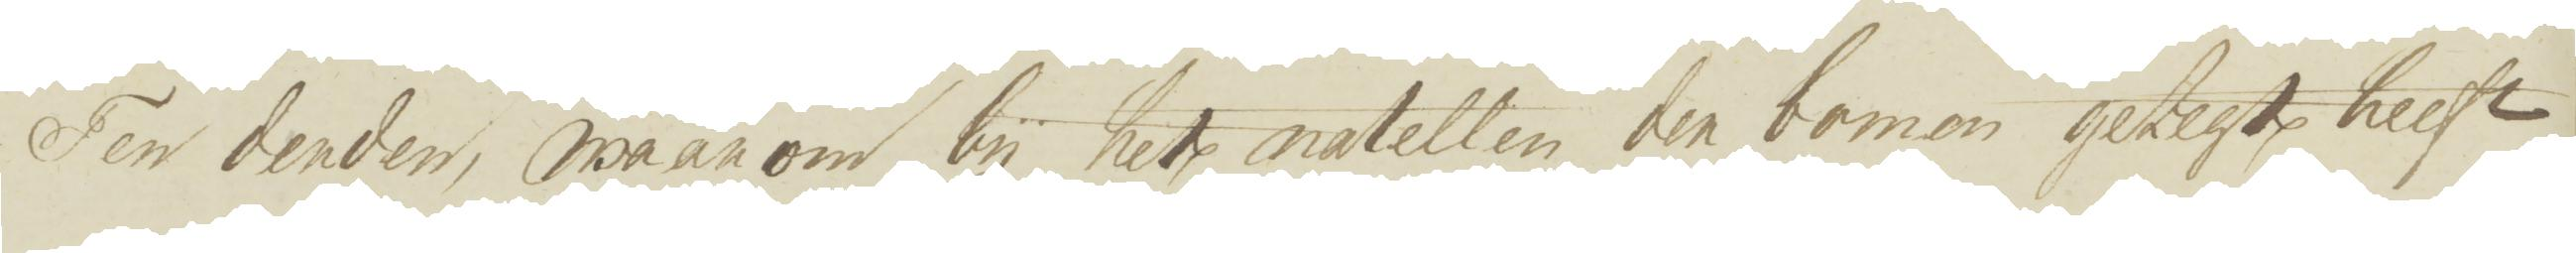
Ten derden, waarom bij het natellen der bomen gezegt heeft
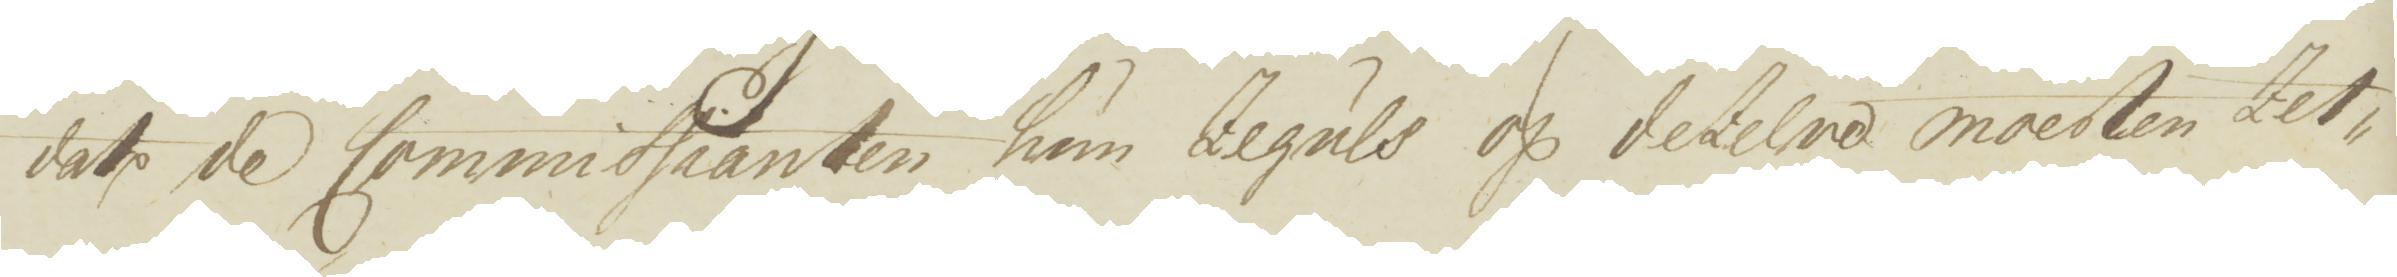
dat de Commissianten hun Zeguls op dezelve moesten Zet„
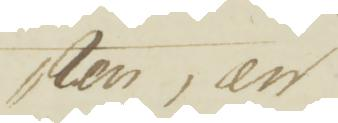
ten, en
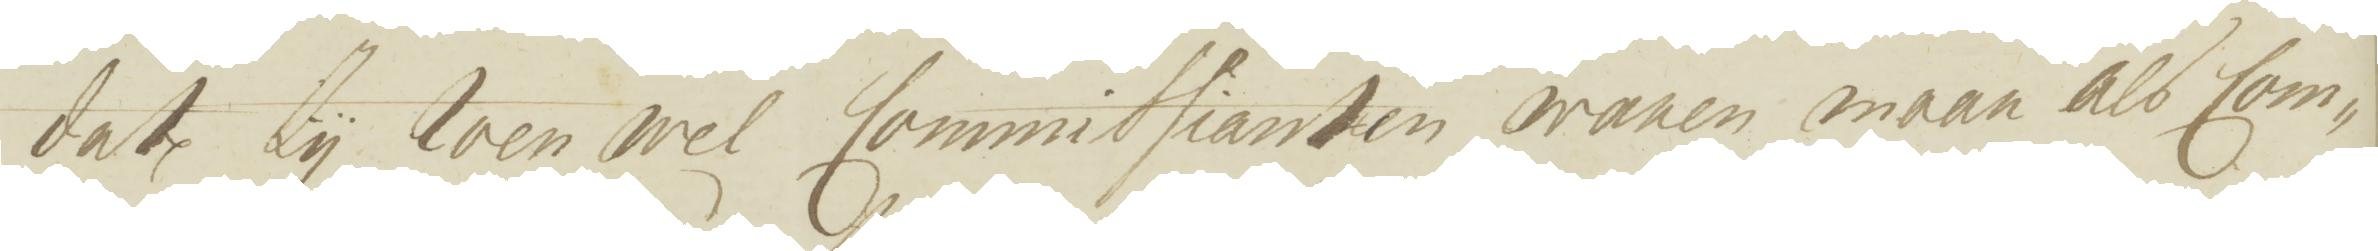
dat Zij toen wel Commissianten waren maar als Com„
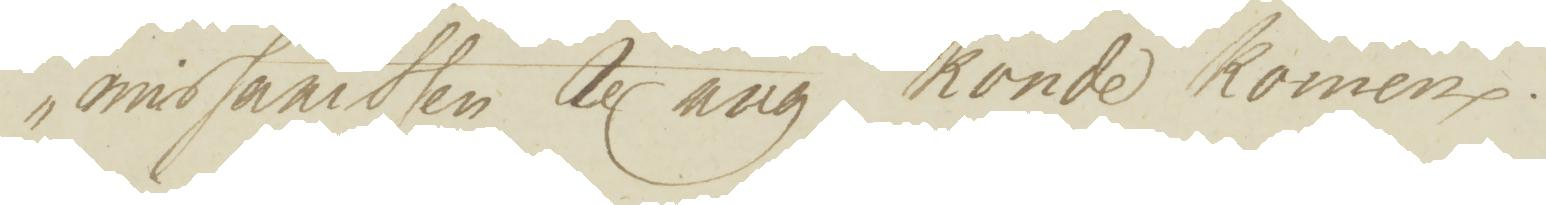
„missarissen terug konde komen.
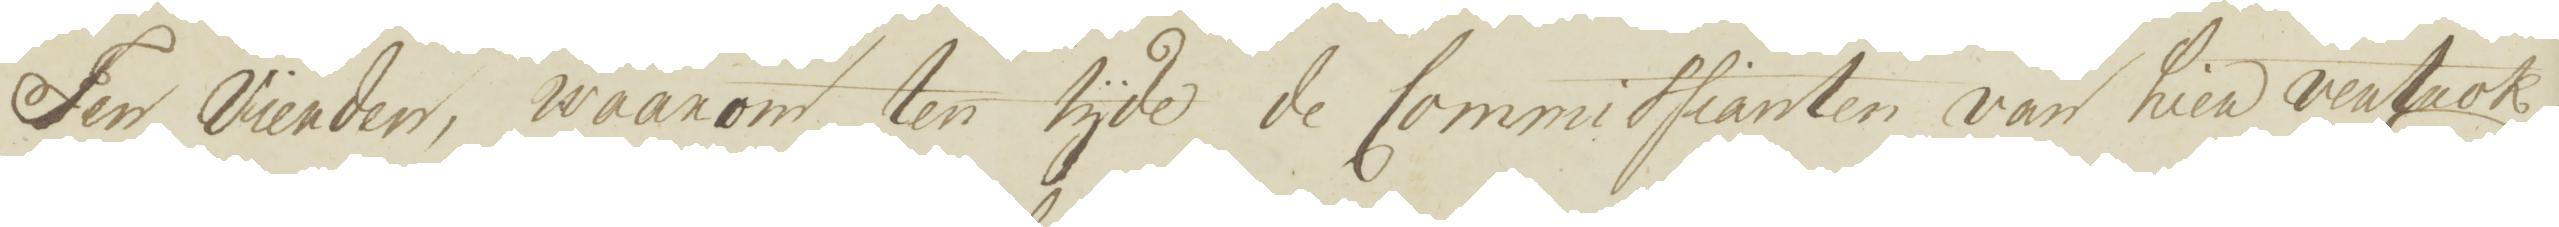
Ten Vierden, waarom ten tijde de Commissianten van hier vertrok
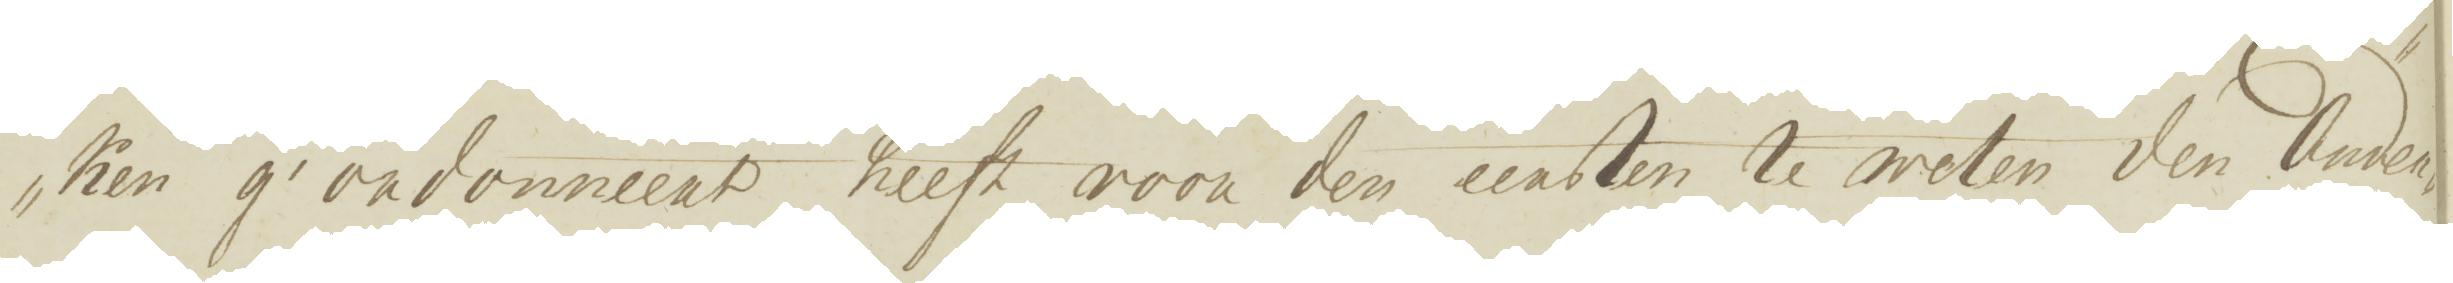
„ken g’ordonneert heeft voor den eersten te weten den Onder„
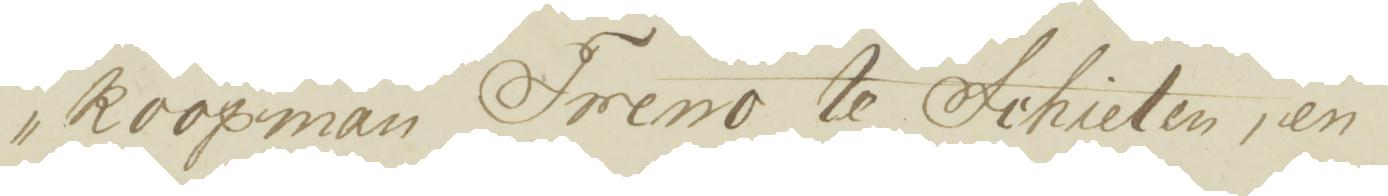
„koopman Treno te Schieten, en
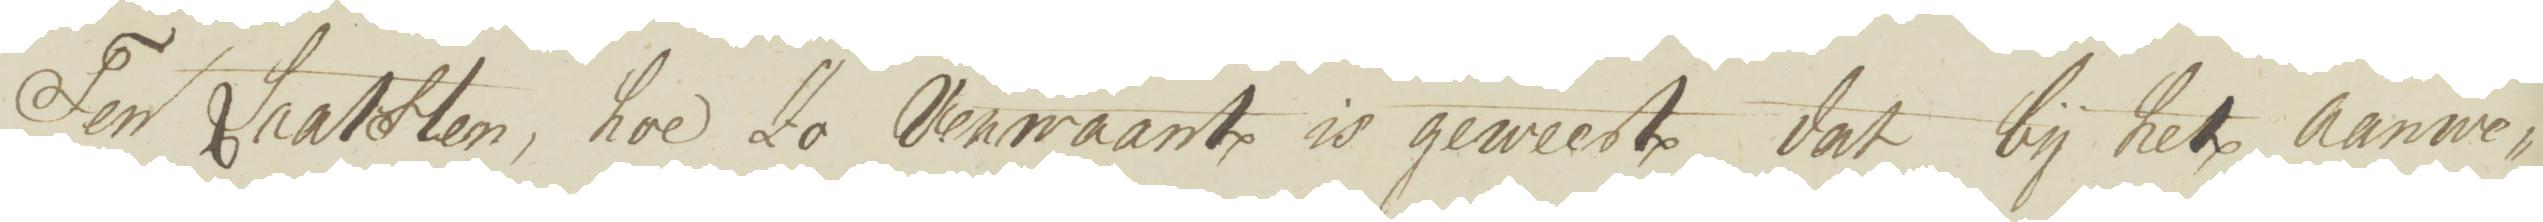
Ten Laatsten, hoe zo Verwaant is geweest dat bij het aanwe„
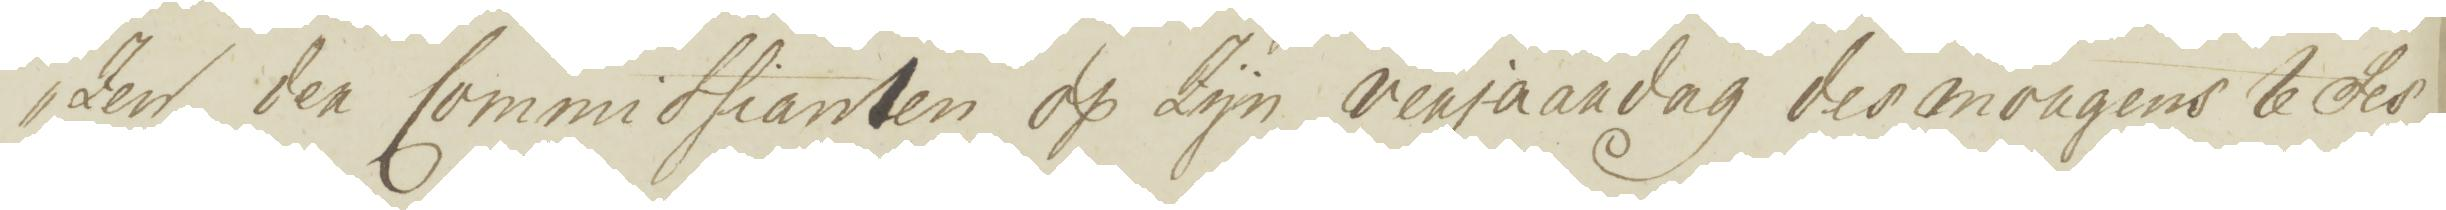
„Zen der Commissianten op Zijn verjaardag des morgens te Ses
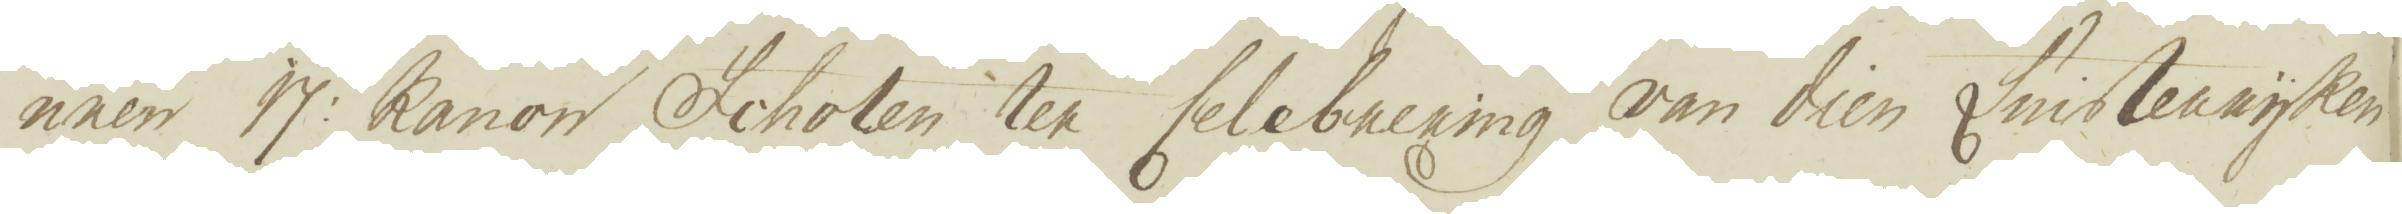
uren 17: kanon Schoten ter Celebrering van dien Luisterrijken
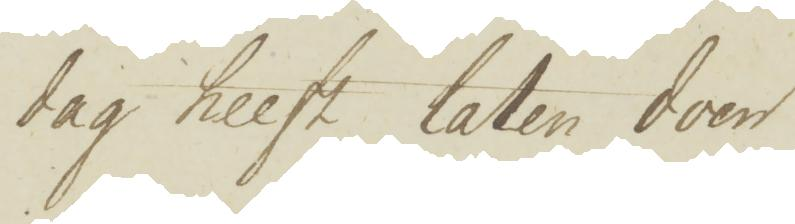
dag heeft laten doen
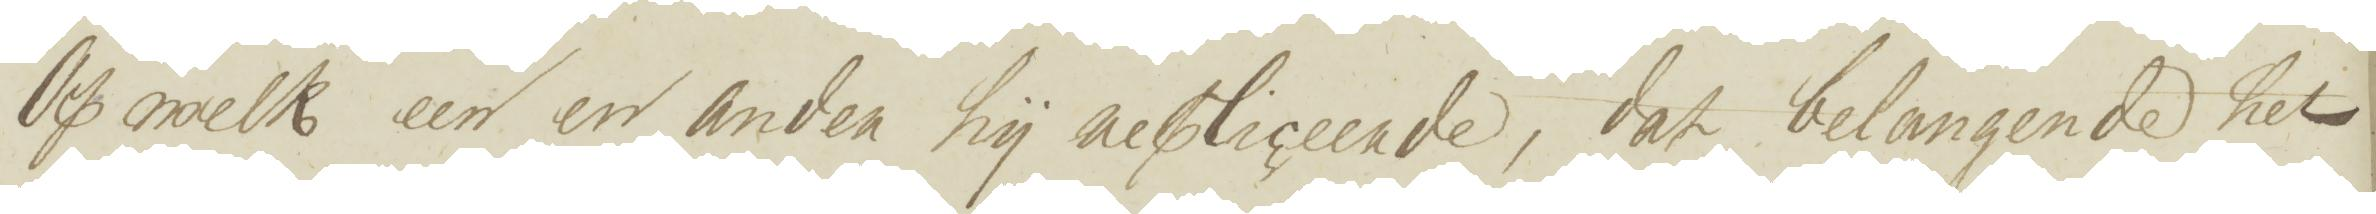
Op welk een en ander hij repliceerde, dat belangende het
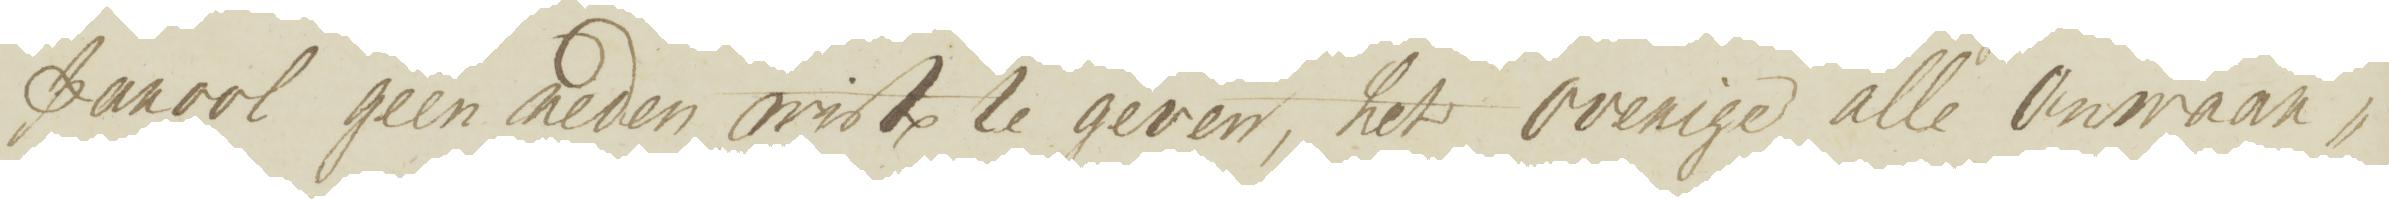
parool geen reden wist te geven, het overige alle Onwaar„
